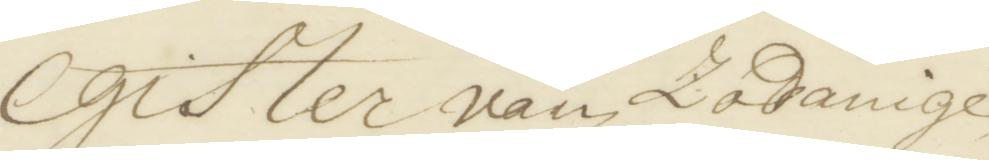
Register van zodanige
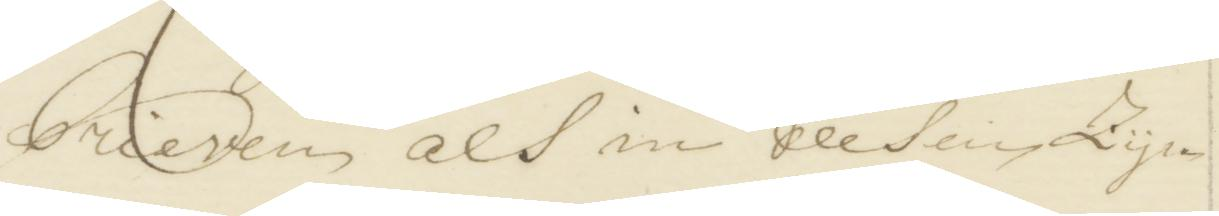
brieven als in deesen zijn
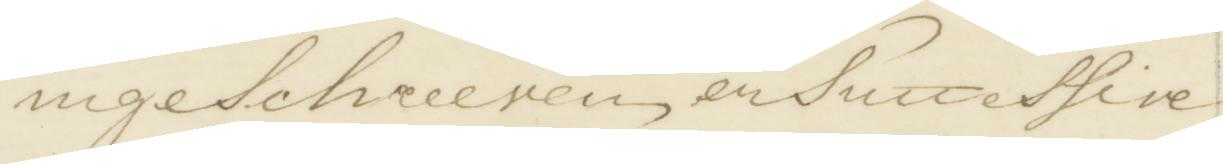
ingeschreeven en successive
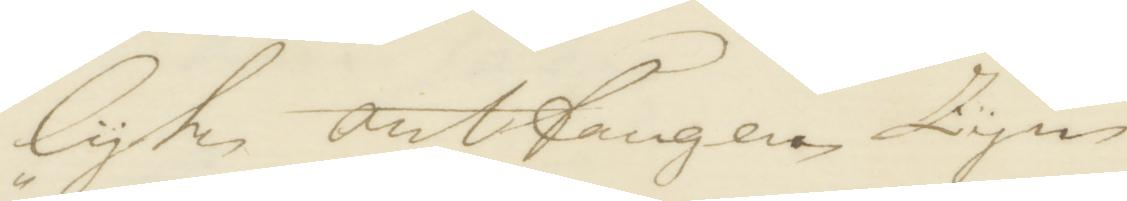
„lijk ontfangen zijn
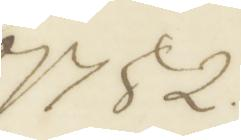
A:o 1752.
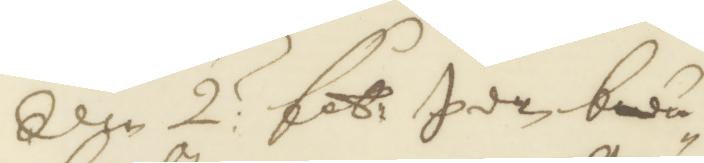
den 2:' feb:' per beu
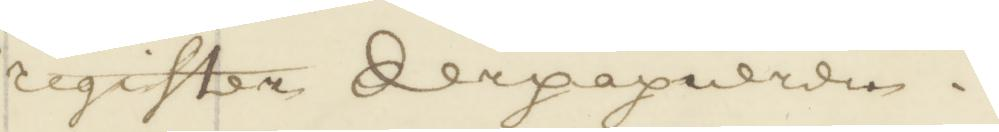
register der papieren .
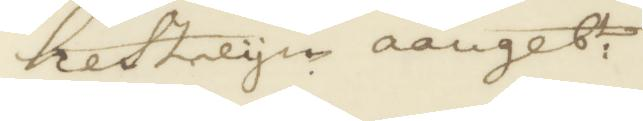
kesteijn aangeb:t
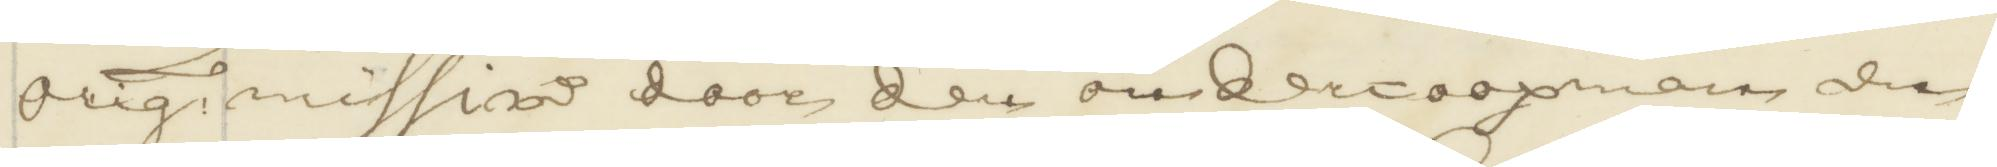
orig: missive door den ondercoopman en
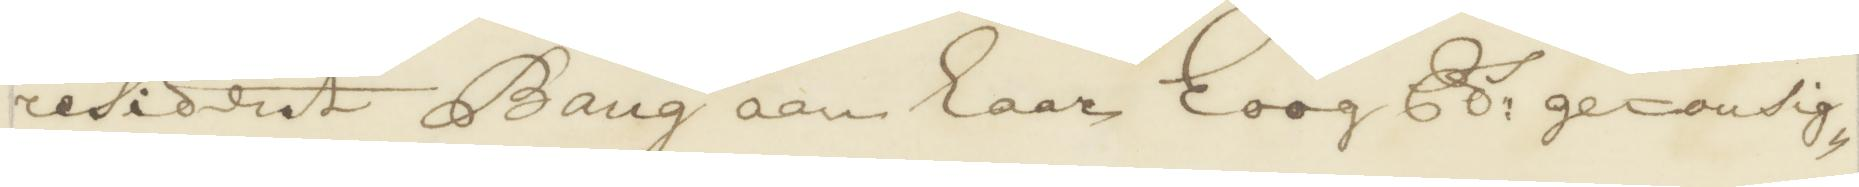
resident Bang aan haar hoog Ed:s geconsig„
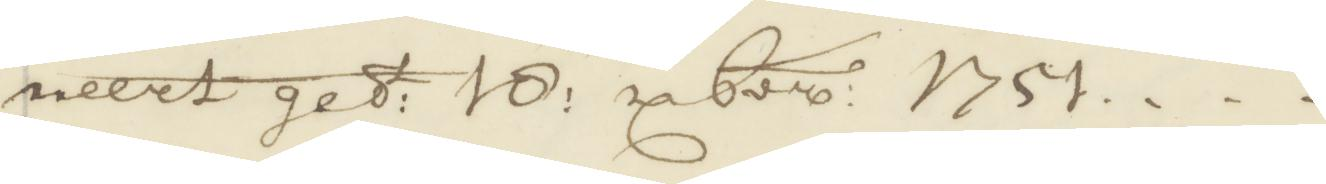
neert ged:t 18:' xber: 1751 . . . .
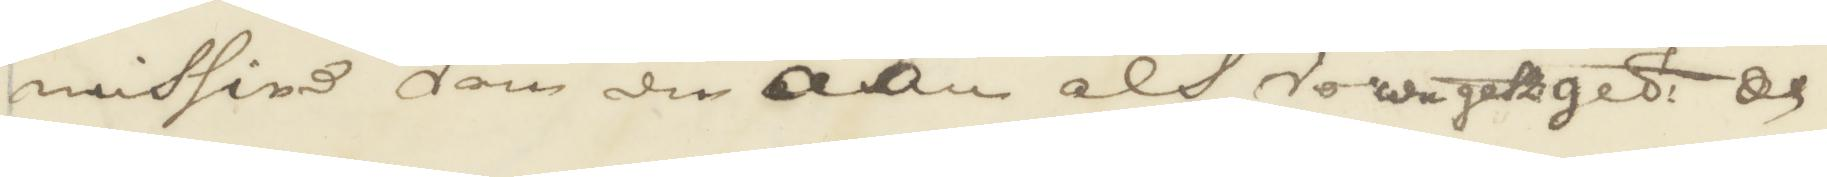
missive van en aan als voren gesz: den
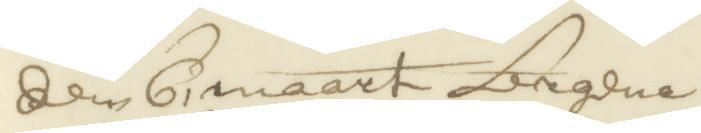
den 6:' maart ter gene
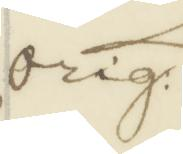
origin:
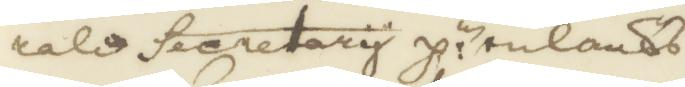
rale secretarij p:r inlands
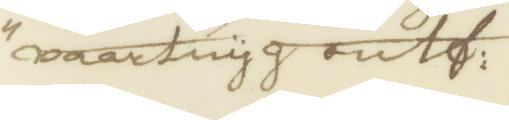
vaartuijg ontf:
